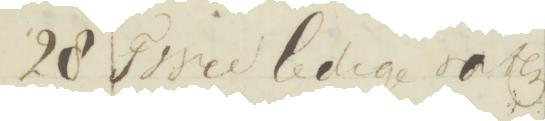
28 Twee ledige vaten
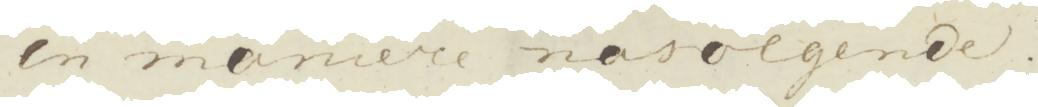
in maniere navolgende
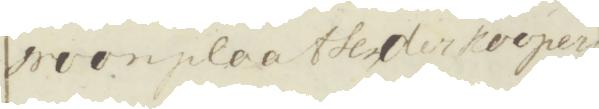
woonplaatsen der koopers
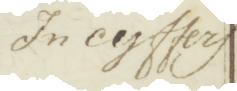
In cyffers
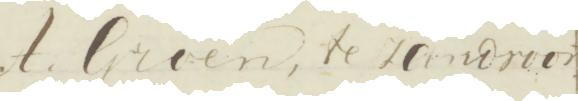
A Groen, te zandvoort
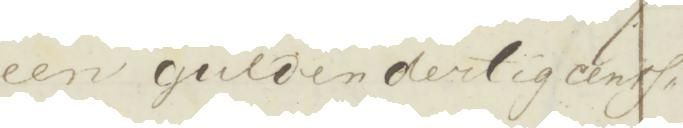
een gulden dertig cents
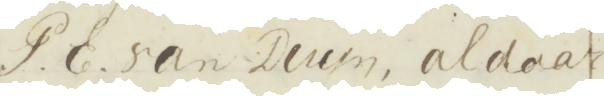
P. E. van Duyn aldaar
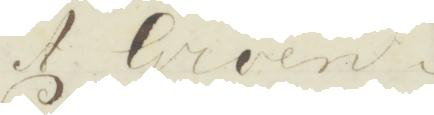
A Groen
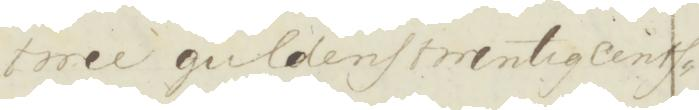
twee guldens twintig cents„
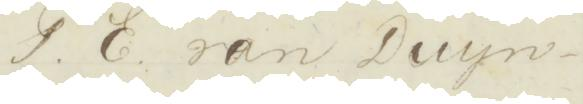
P.E. van Duijn-
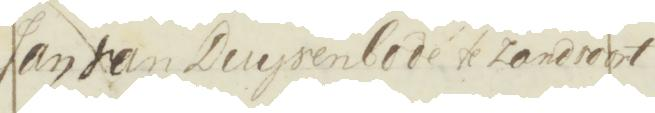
Jan van Duyvenbode te zandvoort
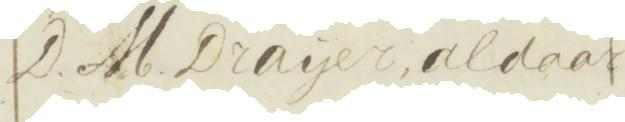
D.M. Draijer, aldaar
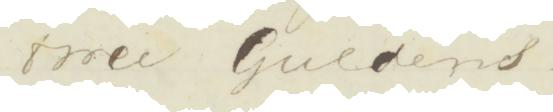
twee Guldens
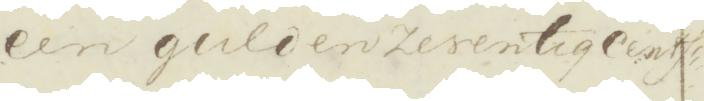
een gulden zeventig cents„
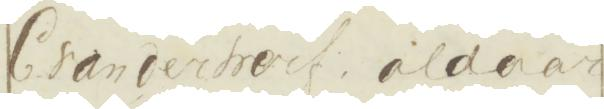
C van der werf aldaar
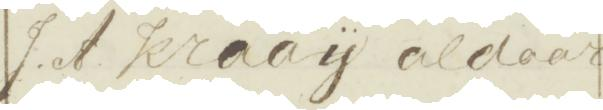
J.A. Kraaij aldaar
